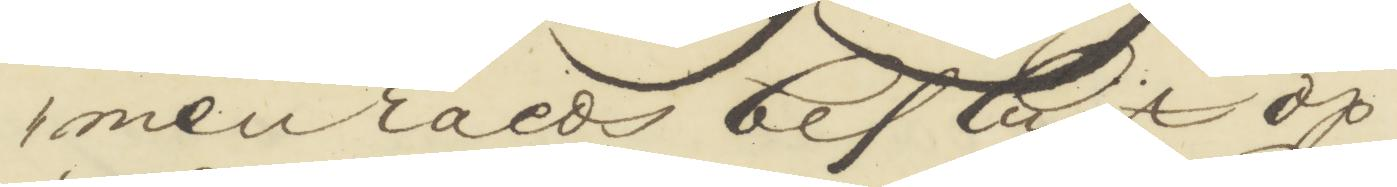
„men raeds besluit op
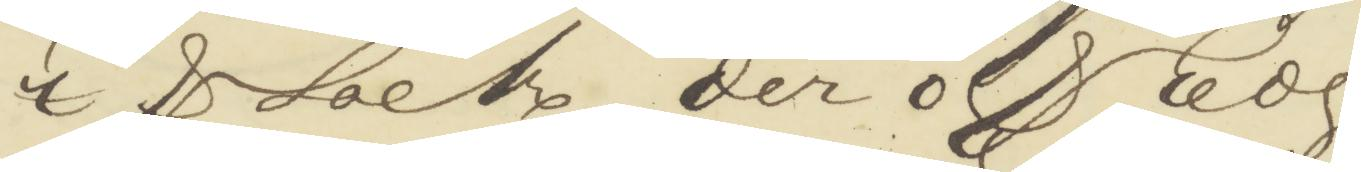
’t versoek der overheden
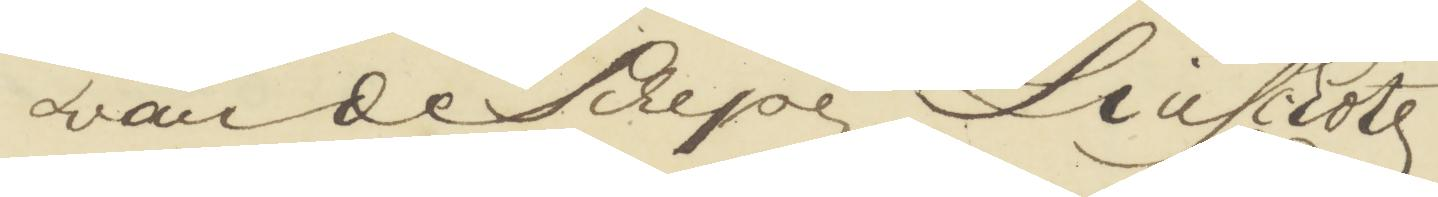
van de schepen Linschoten
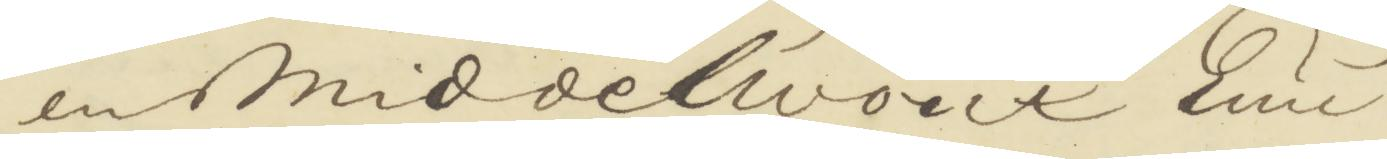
en Middelwout hun
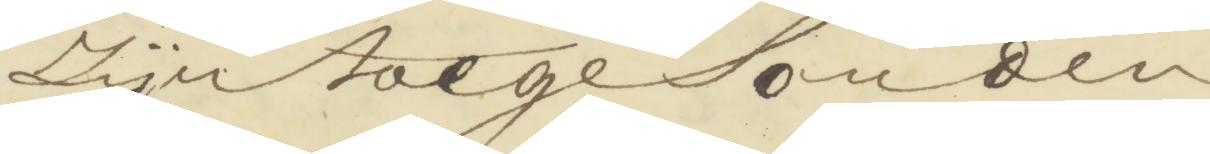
Zijn toegesonden
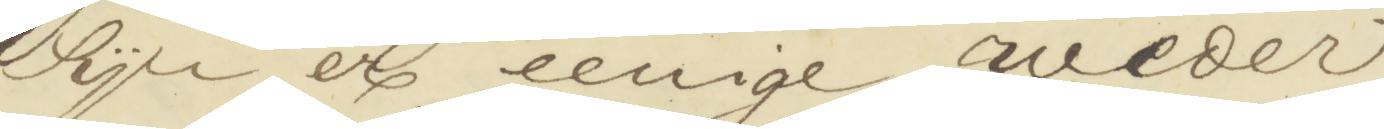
Sijn er eenige weder
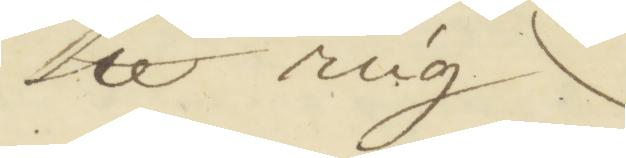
te rug gebracht
